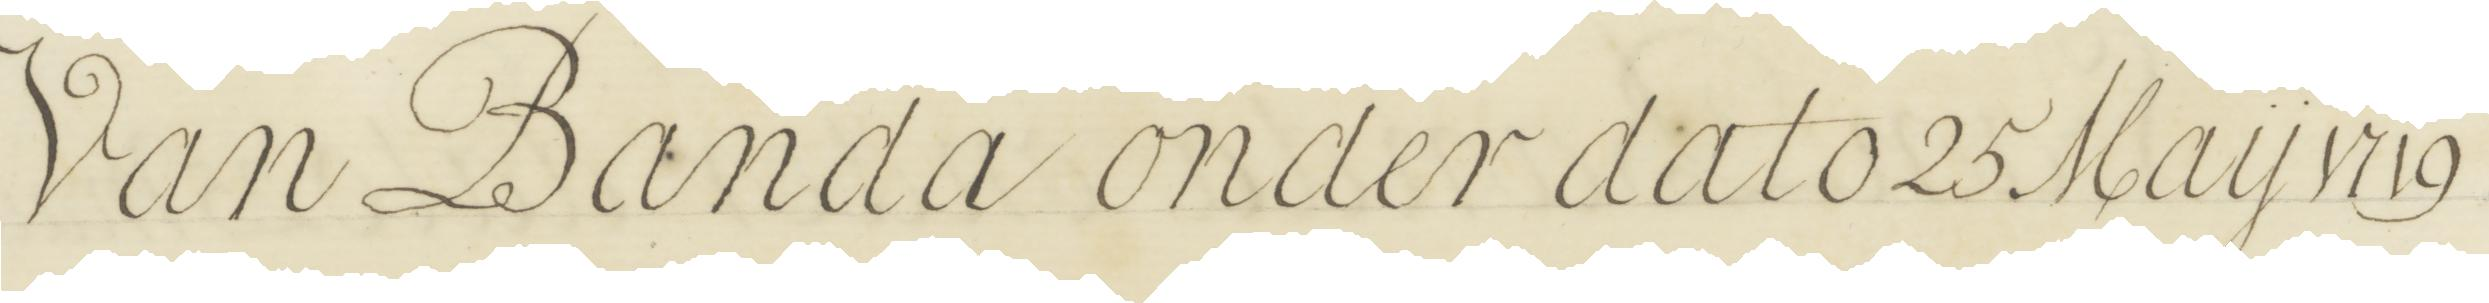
Van Banda onder dato 25 Maij 1719
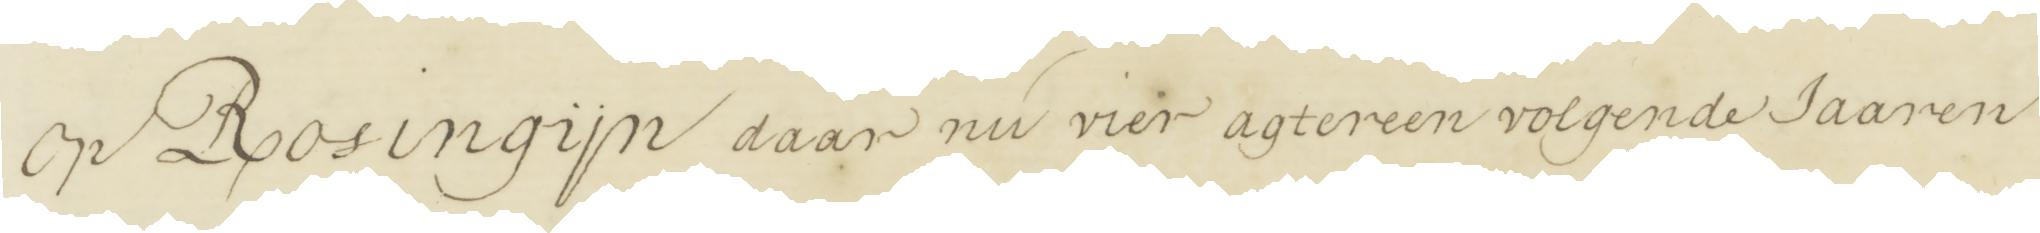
op Rosingijn daar nu vier agtereen volgende Iaaren
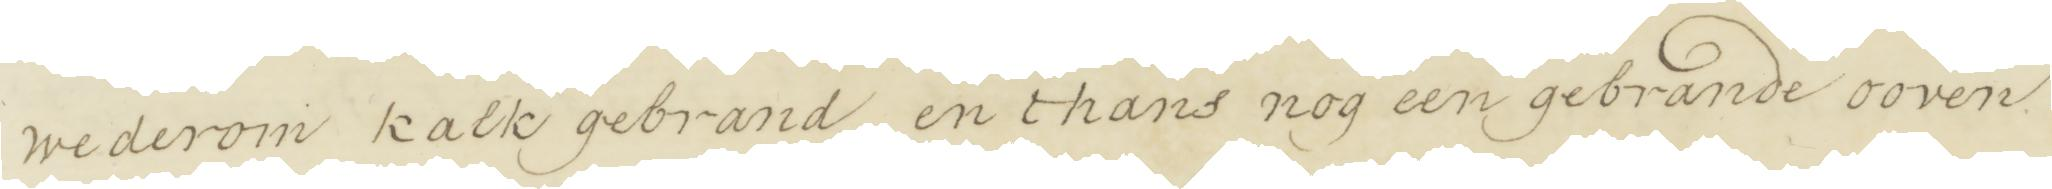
wederom kalk gebrand, en thans nog een gebrande ooven
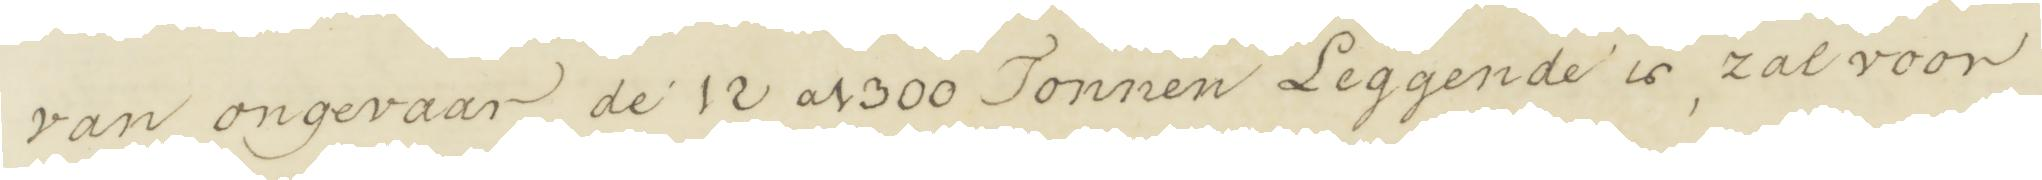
van ongevaar de 12 a 1300 Tonnen Leggende is, zal voor
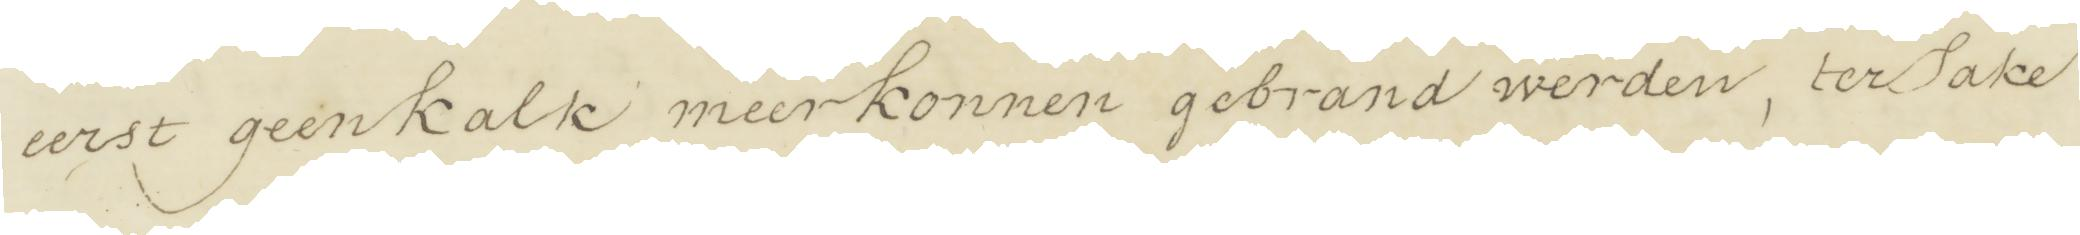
eerst geen kalk meer konnen gebrand werden, ter sake
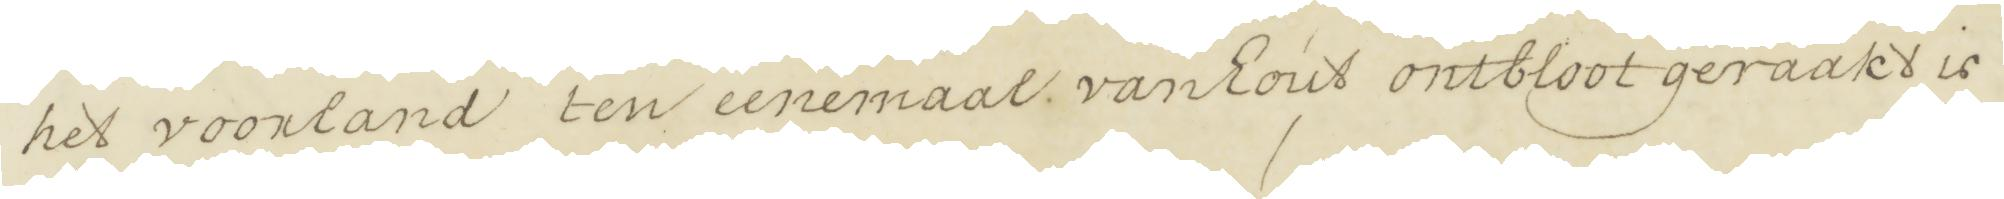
het voorland ten eenemaal van hout ontbloot geraakt is
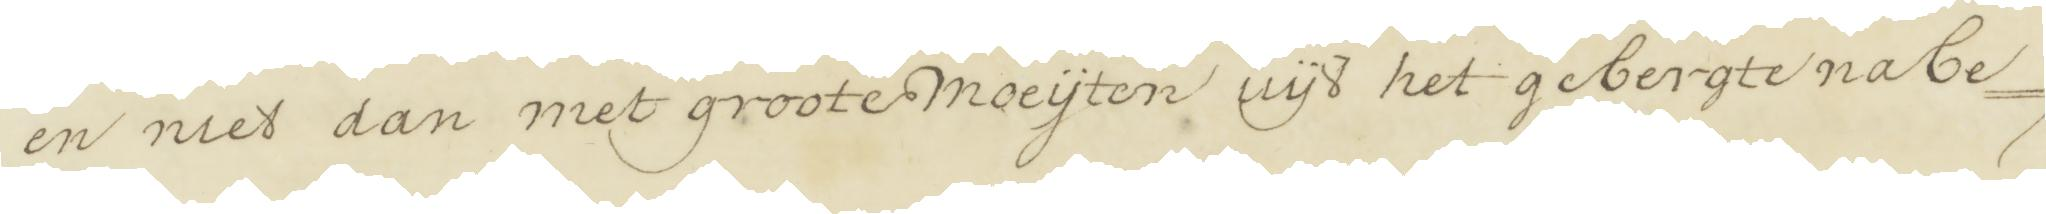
en niet dan met groote moeijten uijt het gebergte na be=
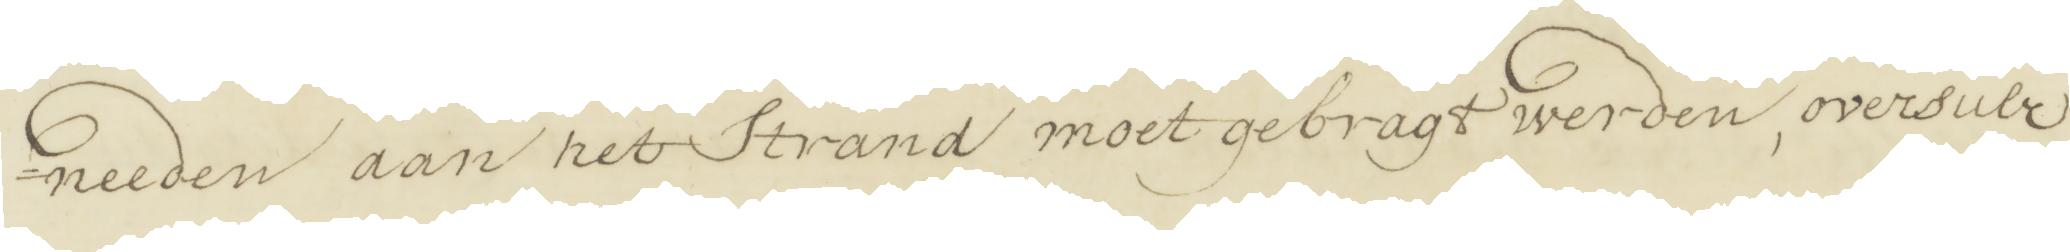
=needen aan het strand moet gebragt werden, oversulx
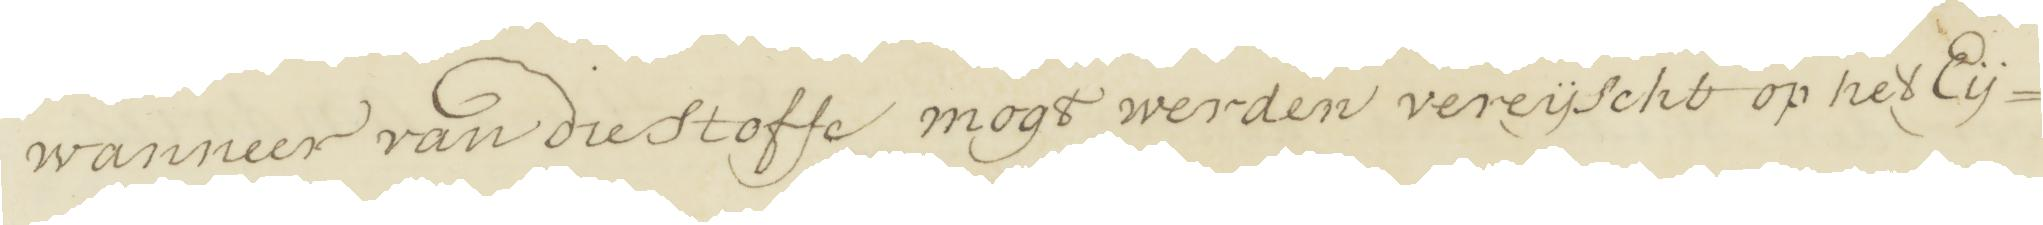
wanneer van die stoffe mogt werden vereijscht op het Eij=
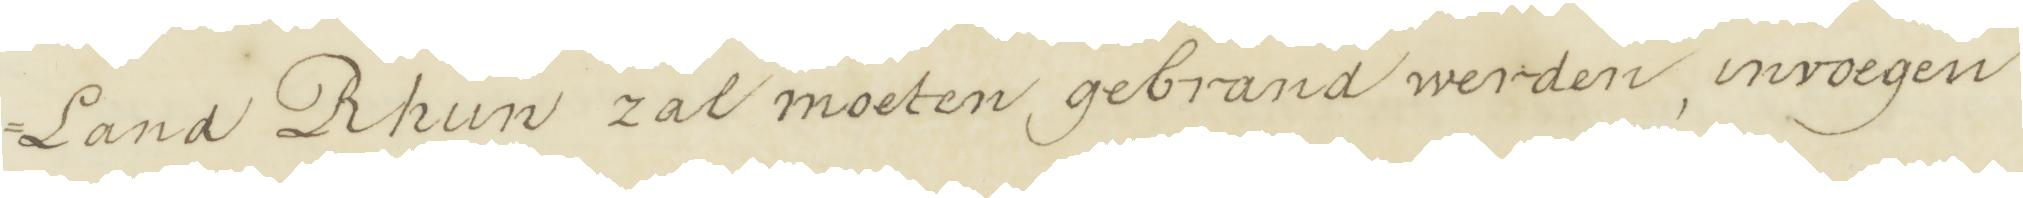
=Land Rhun zal moeten gebrand werden, invoegen
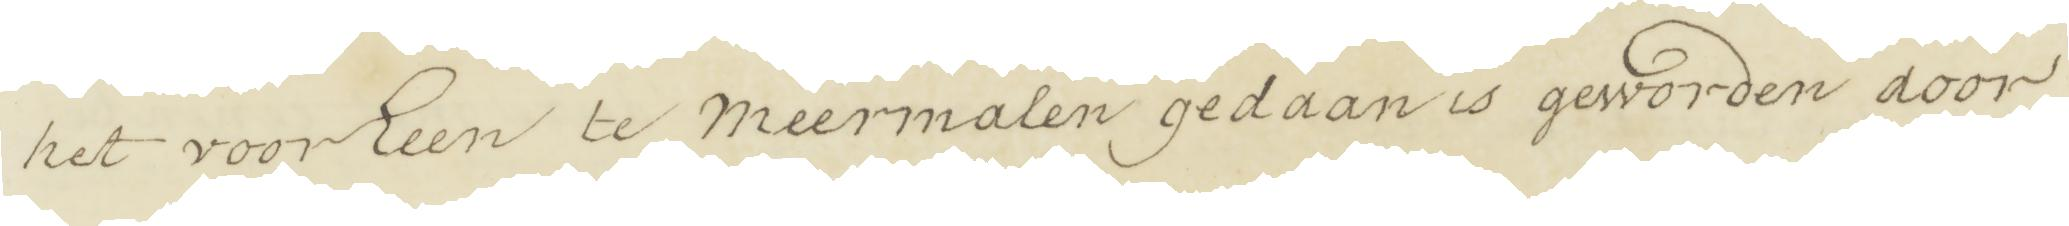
het voorheen te meermalen gedaan is geworden door
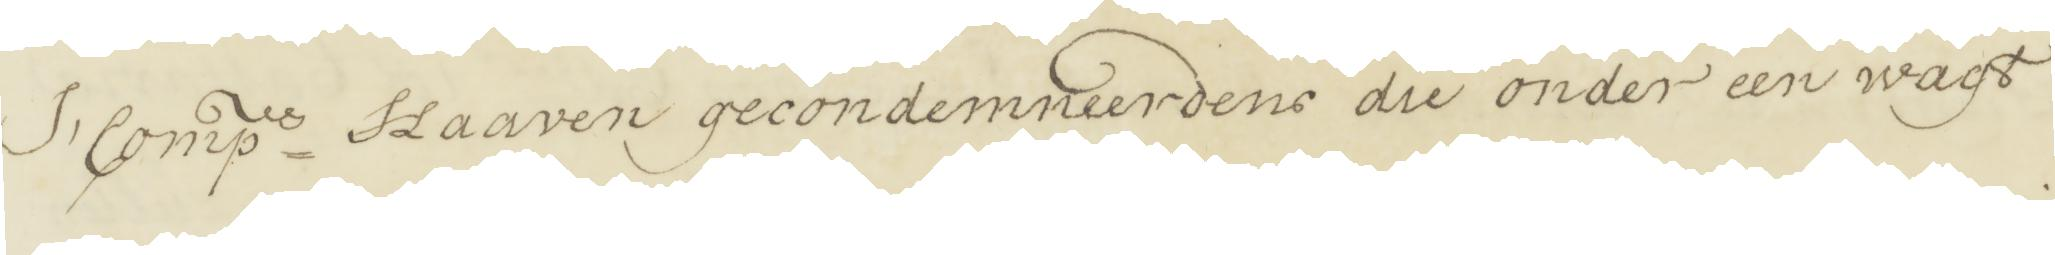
S' Comp=s slaaven gecondemneerdens die onder een wagt
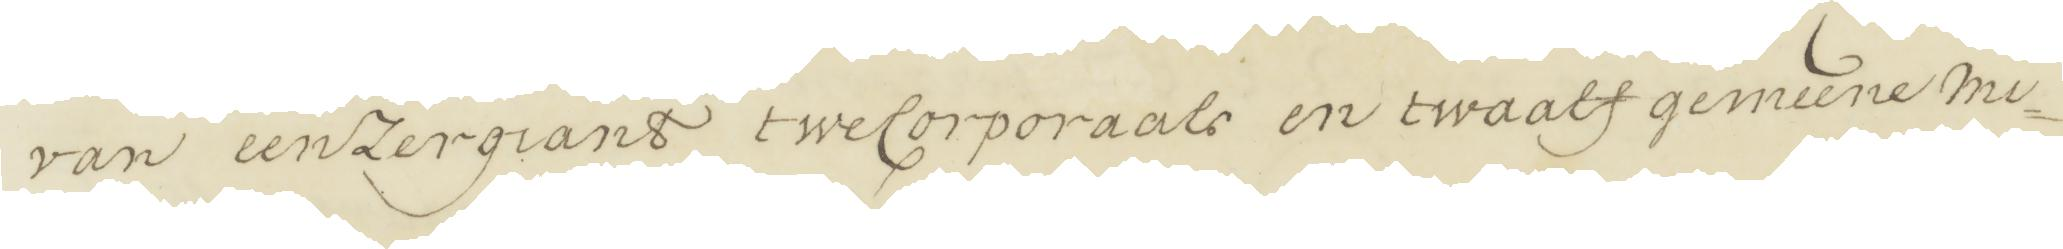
van een zergiant, twe corporaals en twaalf gemeene mi„
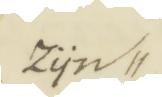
zijn „
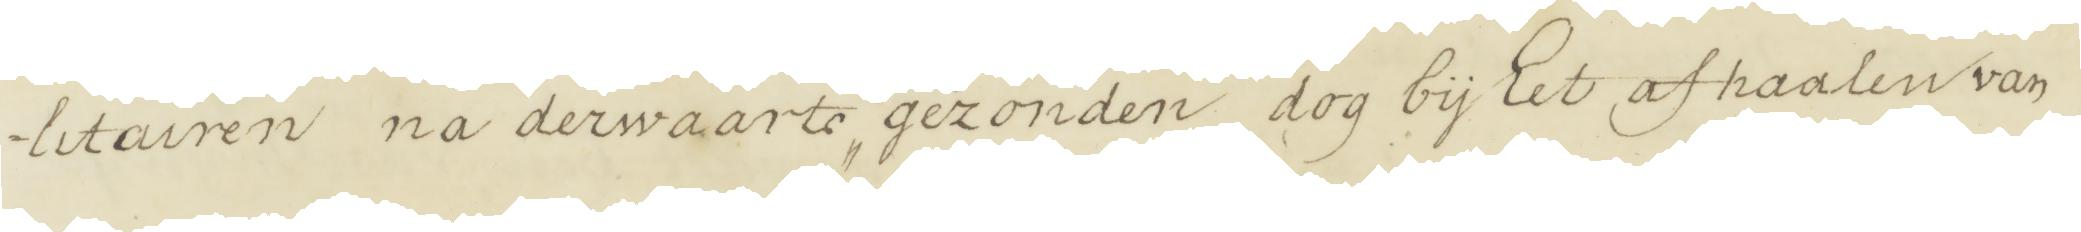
-litairen na derwaarts „ gezonden, dog bij het afhaalen van
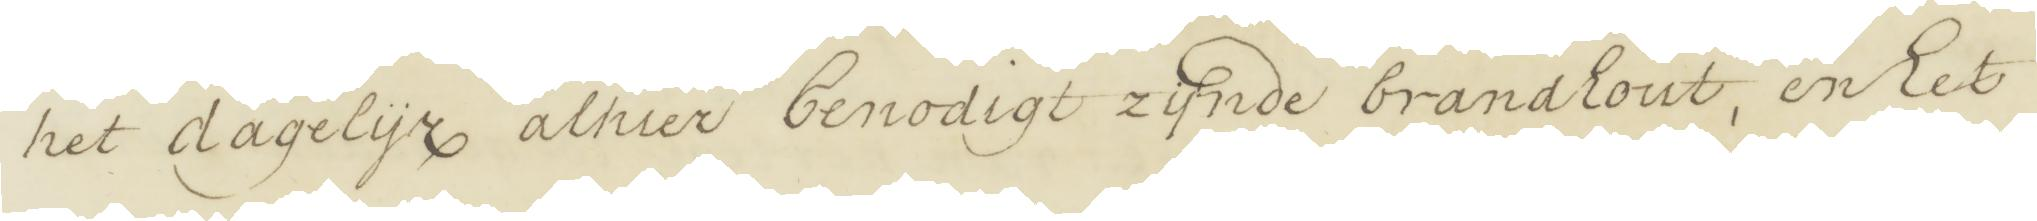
het dagelijx alhier benodigt zijnde brandhout, en het
